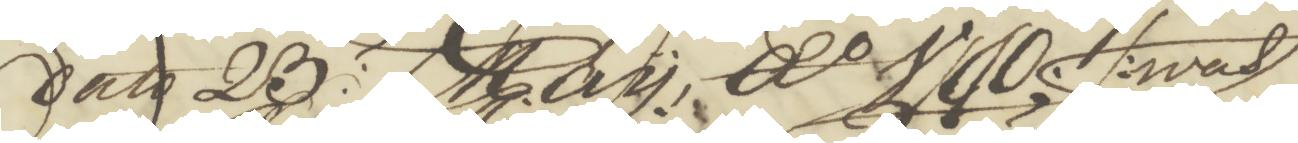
dato 23:' Maij, Ao 1740; /:was
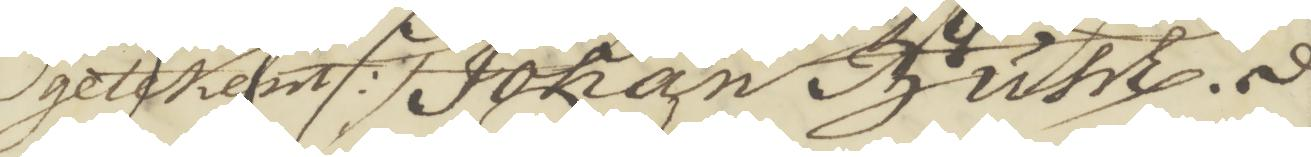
getekent:/ Johan Busch. -
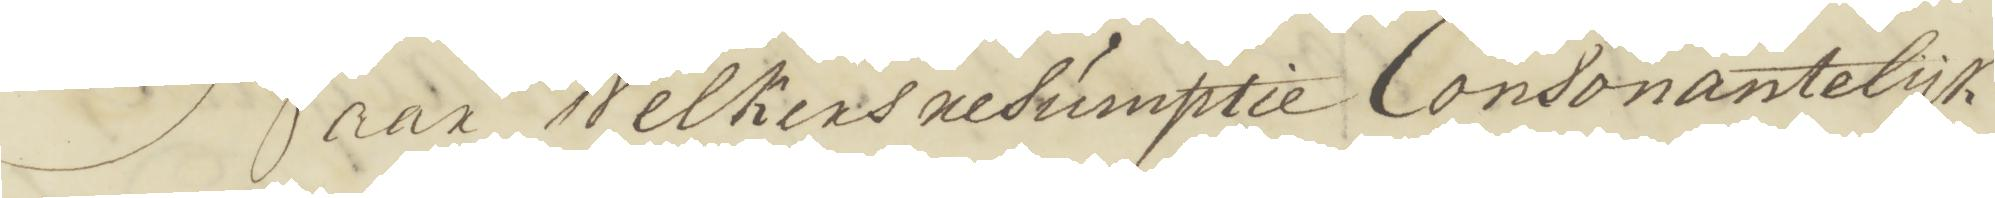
Naar welkers resumptie Consonantelijk
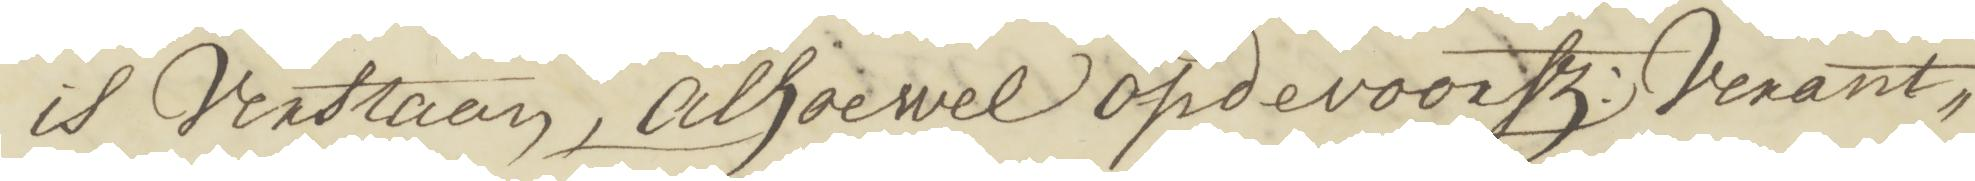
is verstaan, alhoewel op de voorsz: verant„
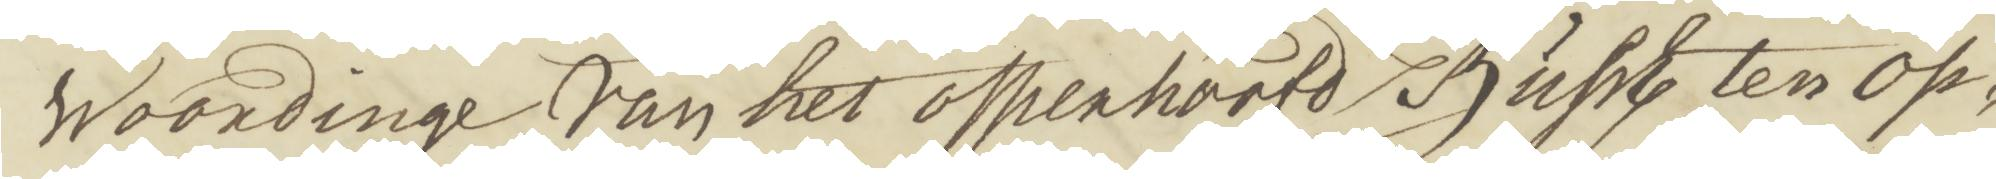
woordinge van het opperhoofd Busch ten op„
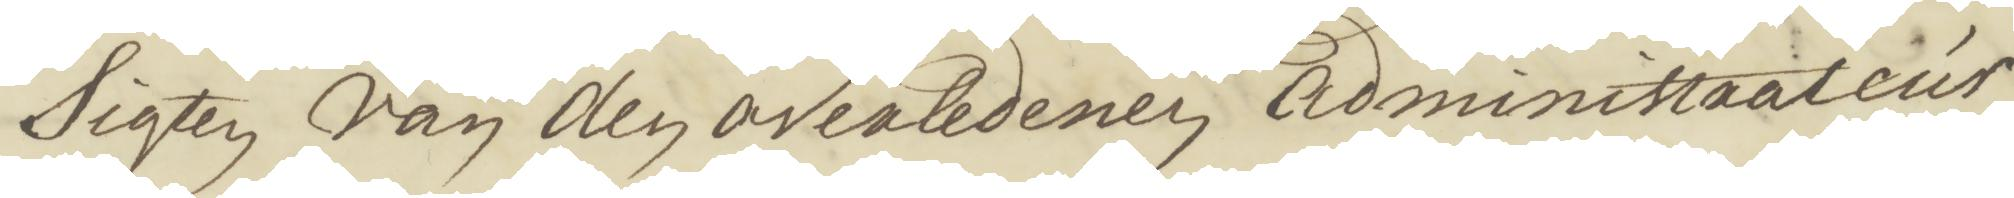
sigten van den overledenen Administrateur
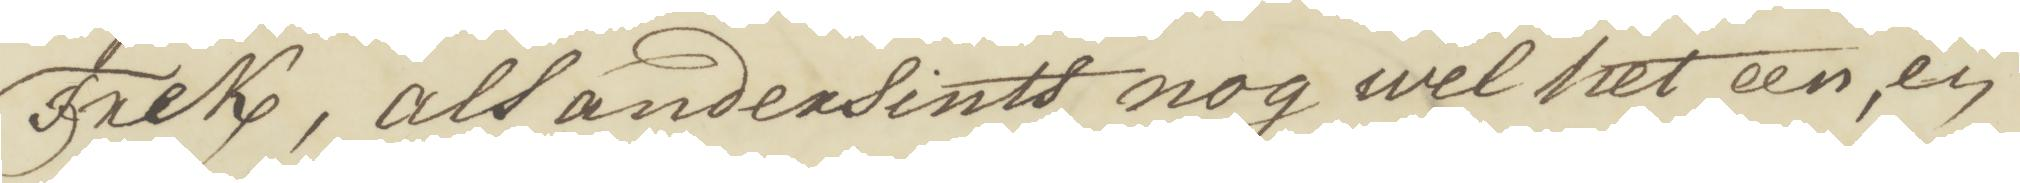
Trek, als andersints nog wel het een, en
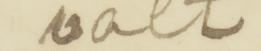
valt
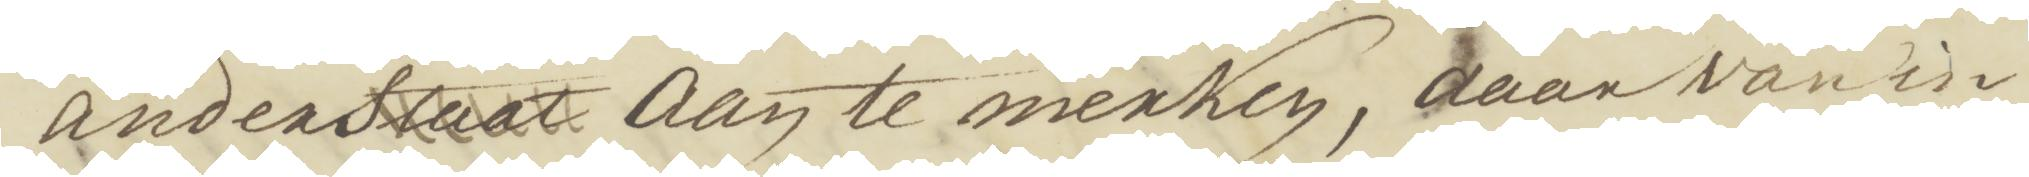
anderstaat Aan te merken, daar van in
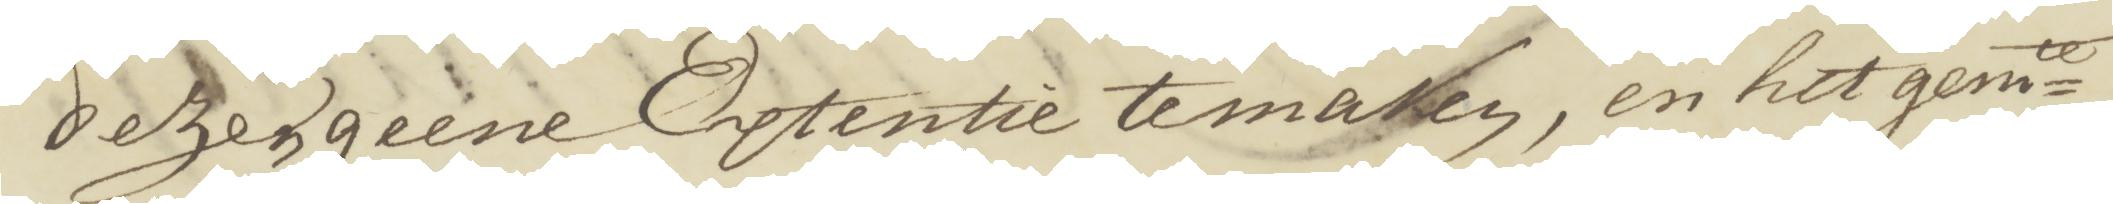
dezen geene Extentie temaken, en het gem=te
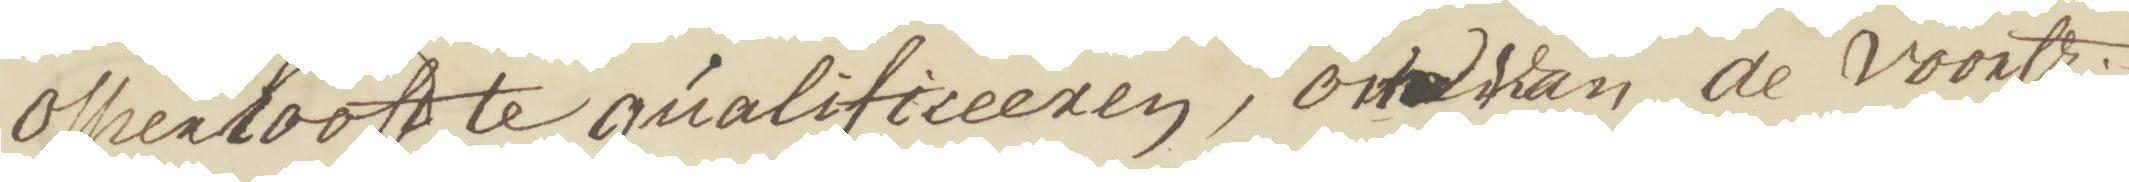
opperhooft te qualificeeren, ourzan de voorsz:
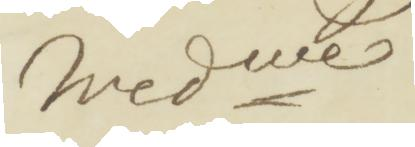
wed:we
